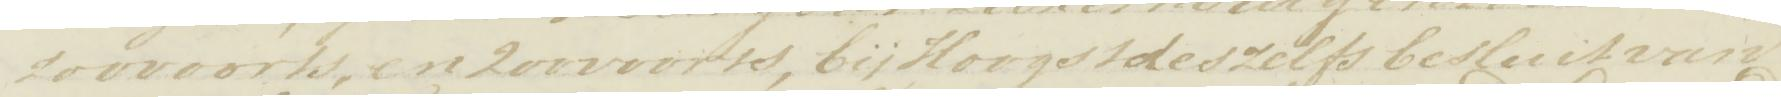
zoovoort, en zoovoorts, bij Hoogst deszelfs besluit van
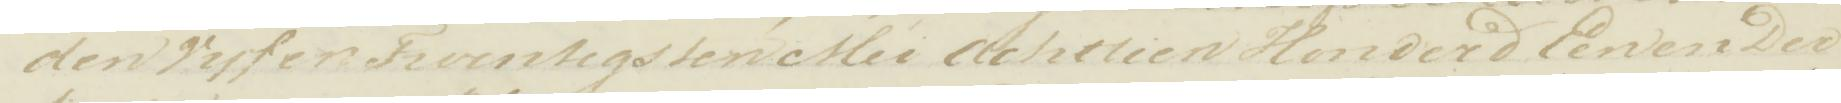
den Vyf en Twintigsten Mei achttien Honderd Een en Der
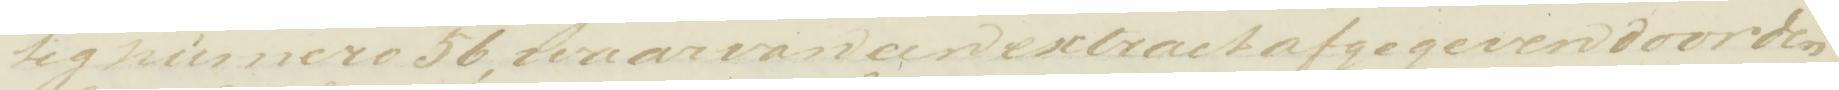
tig numero 56, waar van een extract afgegeven door den
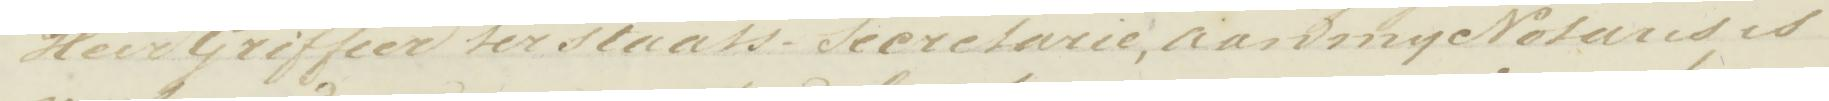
Heer Griffier ter staats-Secretarie, aan my Notaris is
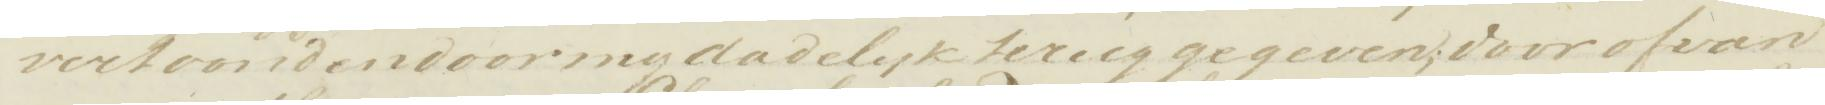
vertoond en door my dadelyk terug gegeven; door of van
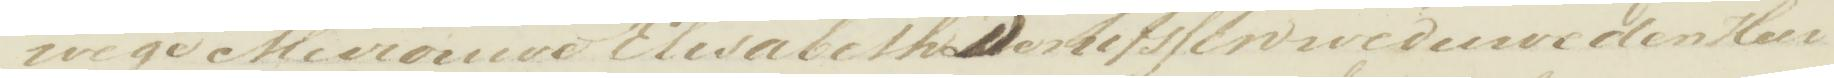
wege Mevrouw Elisabeth desselfsen weduwe den Heer
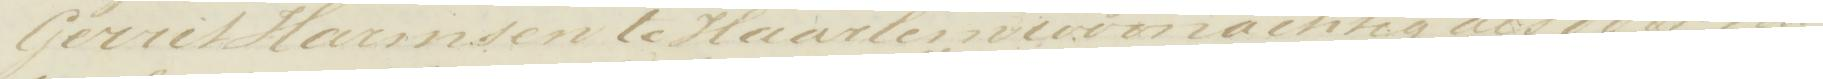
Gerrit Harmsen te Haarlem woonachtig, als door nu
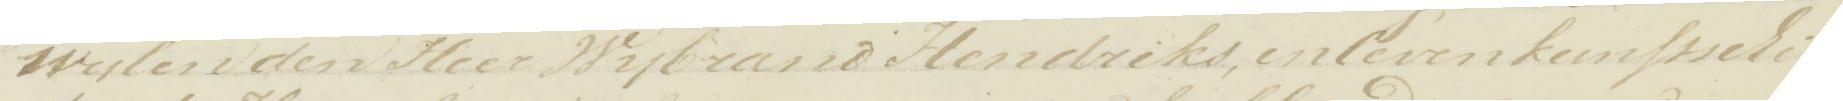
wylen den Heer Wybrand Hendriks, in leven kunstschil
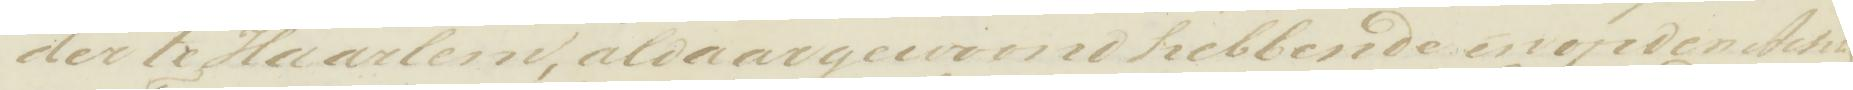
der te Haarlem, aldaar gewoond hebbende en op den Acht
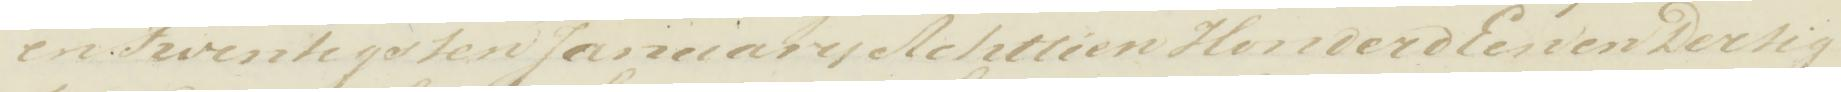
en Twintigsten January Achttien Honderd Een en Dertig
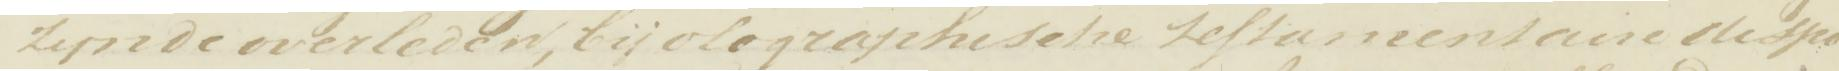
zynde overleden, bij olographische testamentaire dispo
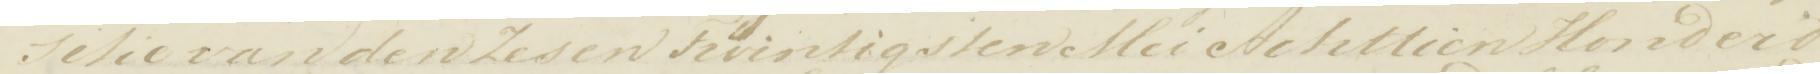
sitie van den Zes en Twintigsten Mei Achttien Honderd
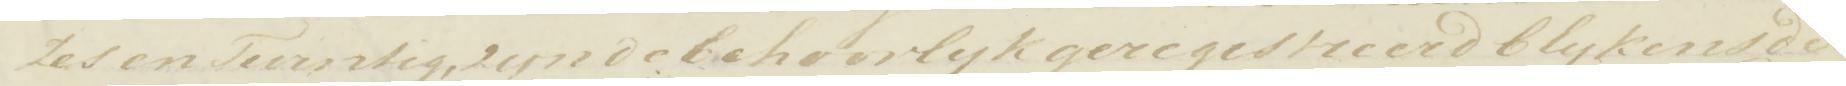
Zes en Twintig, zynde behoorlyk geregistreerd blykens de
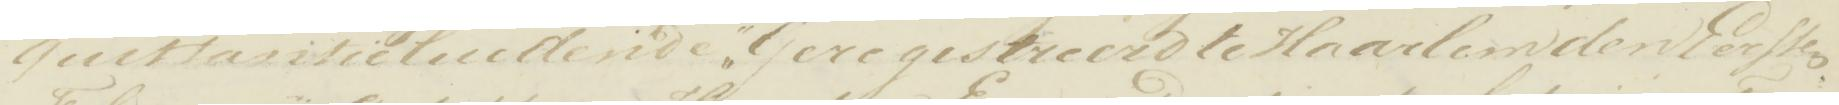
quittantie luidende, Geregistreerd te Haarlem den Eersten,
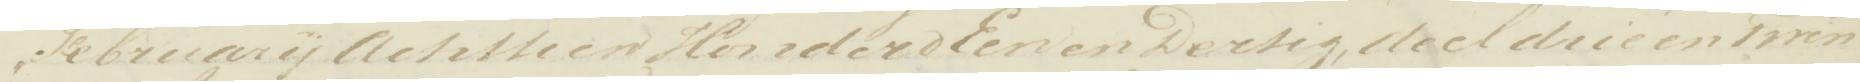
Februarij Achttien Honderd Een en Dertig, deel drie en twin
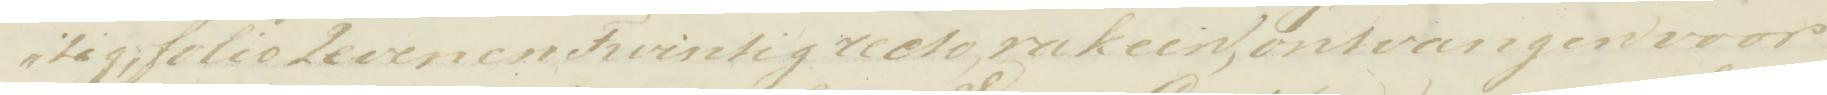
„tig, folio zeven en twintig recto, vak een, ontvangen voor
